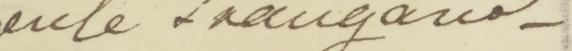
en te Trangano -
